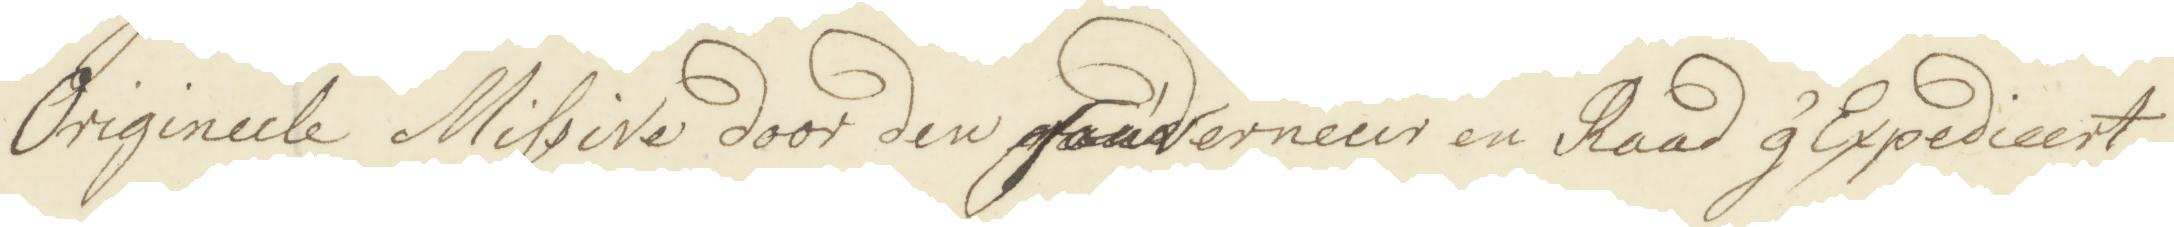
Origineele Missive door den gouverneur en Raad g’Expedieert
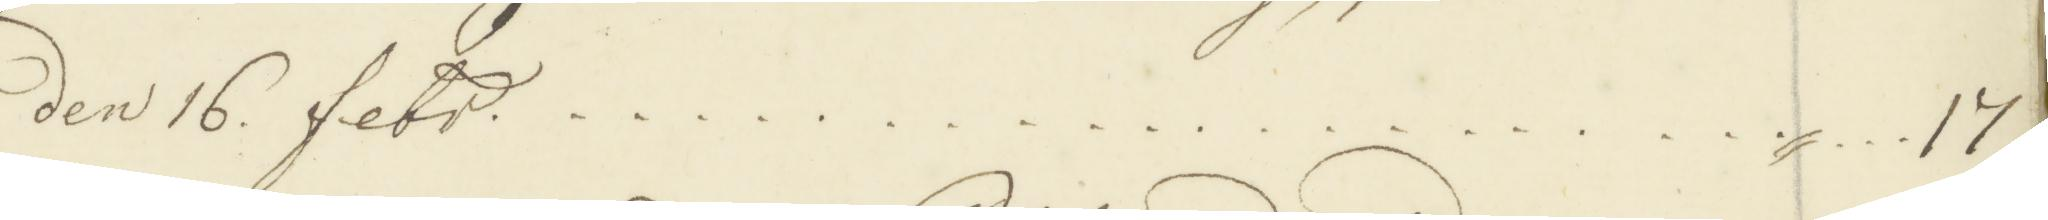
den 16. febr. - - - - - - - - - - - - - - - - - - - - „ - - - 17.
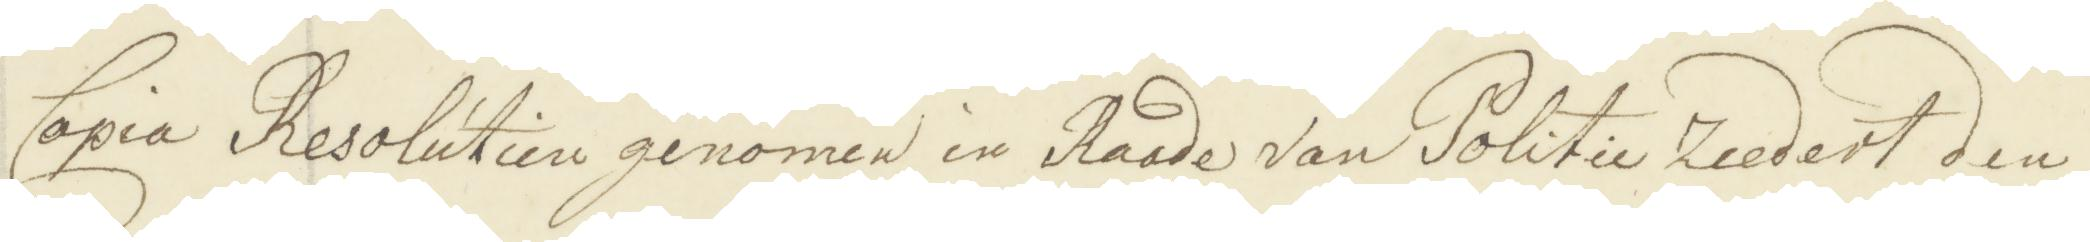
Copia Resolutien genomen in Raade van Politie zeedert den
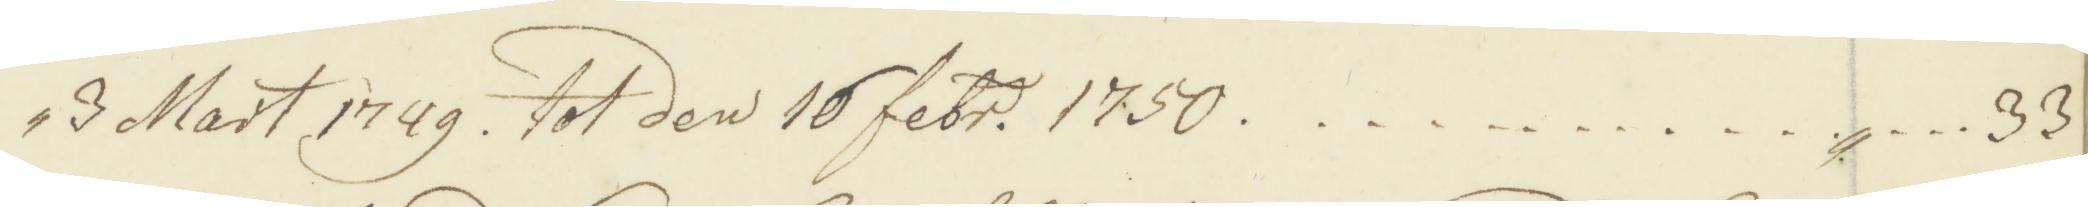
„3 Mart 1749. tot den 16 febr. 1750. - - - - - - - - - - „ - - - 33
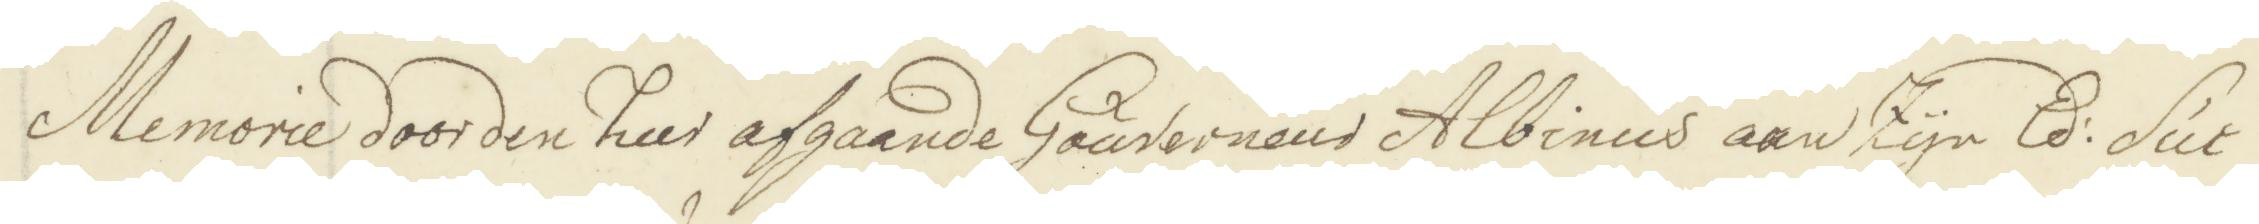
Memorie door den heer afgaande Gouverneur Albinus aan Zijn Ed: Suc
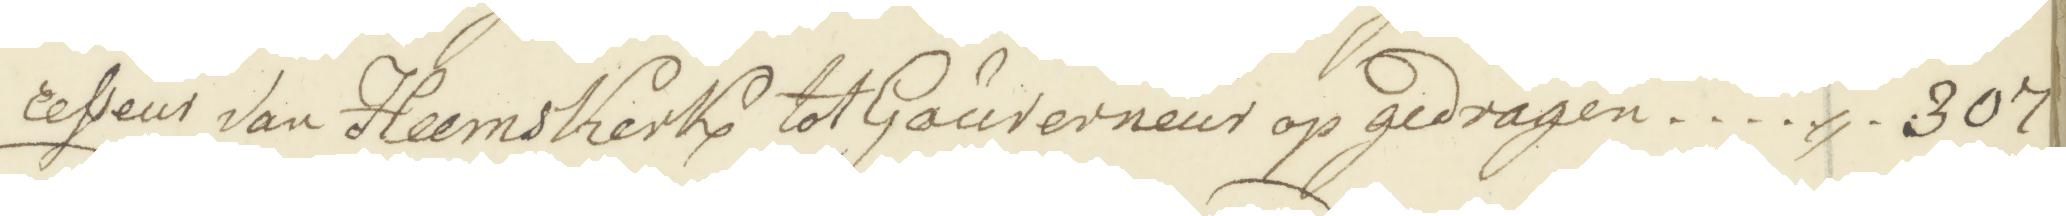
cesseur van Heemskerk tot Gouverneur op gedragen - - - - - „ - - 307
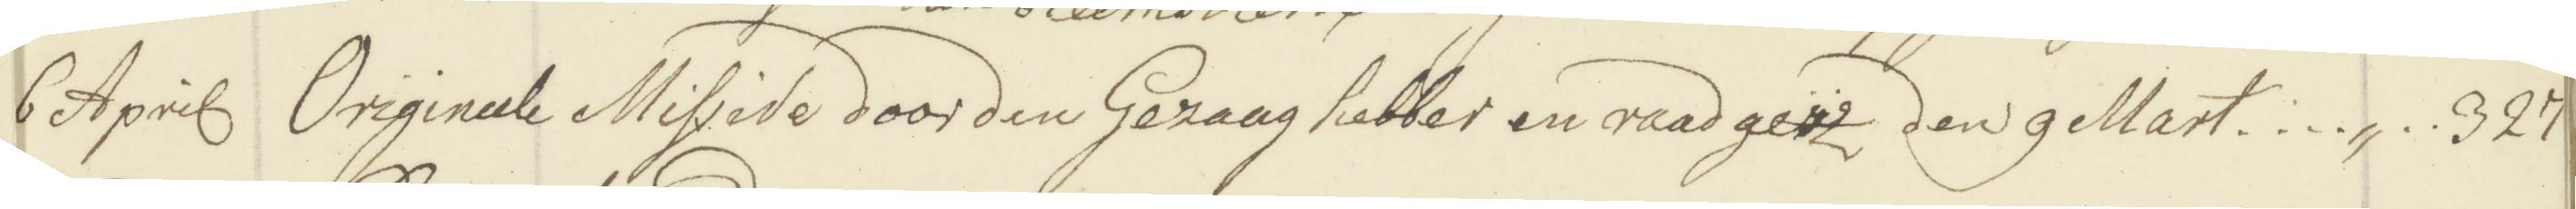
6 April Origineele Missive door den Gezaag hebber en raad gesz den geMart - - - - „ - - 327
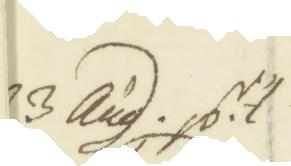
23 Aug. p.r 't
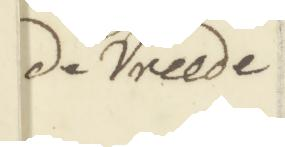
de vreede
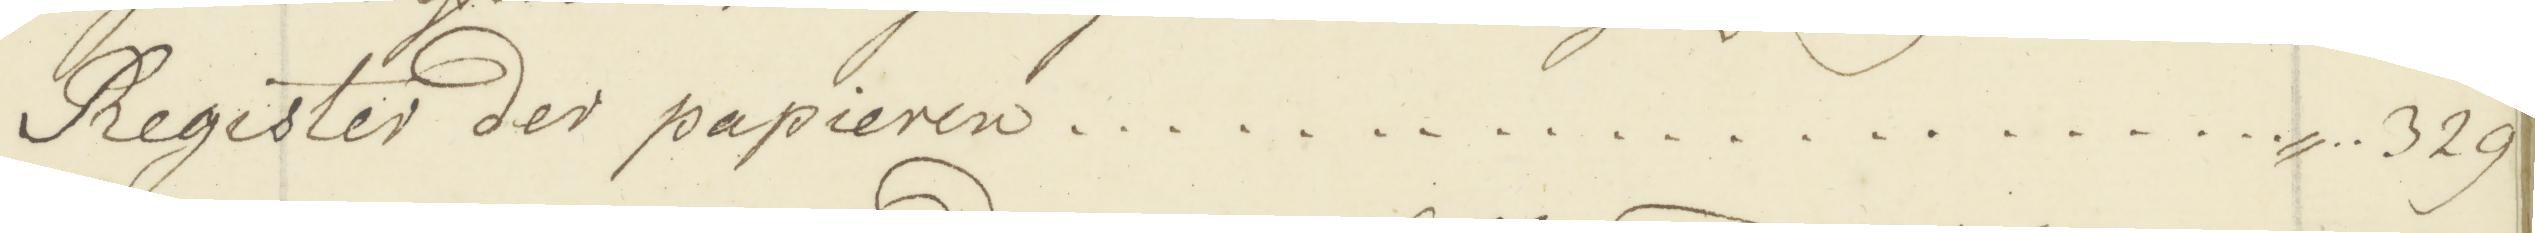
Register der papieren - - - - - - - - - - - - - - - - - - - - -„ - - 329
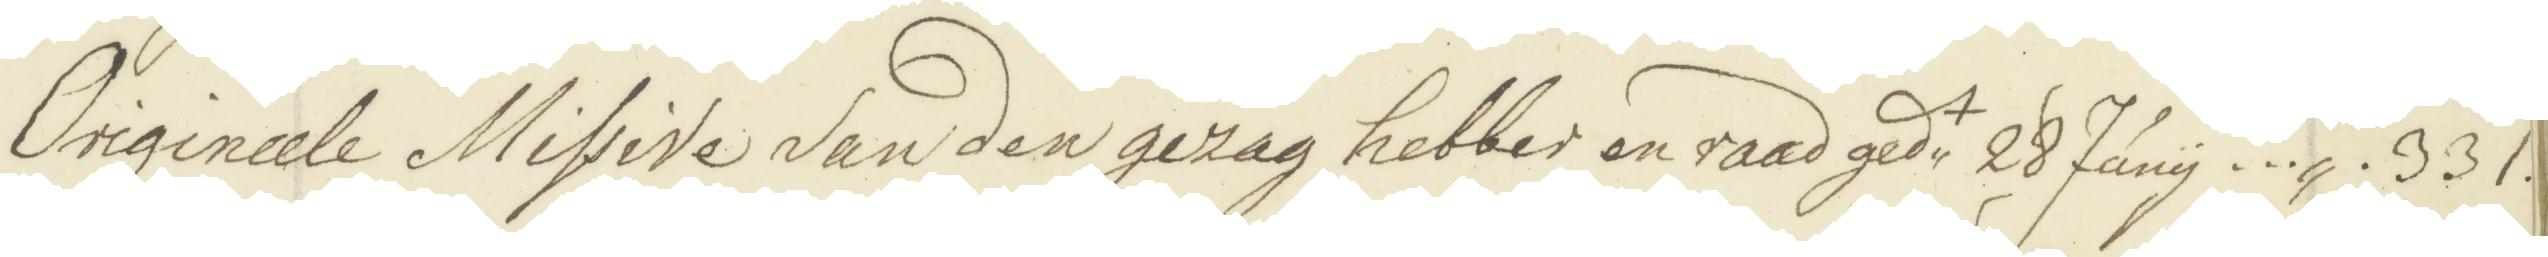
Origineele Missive van den gezag hebber en raad ged„t 28 Junij - - - „ - 331.
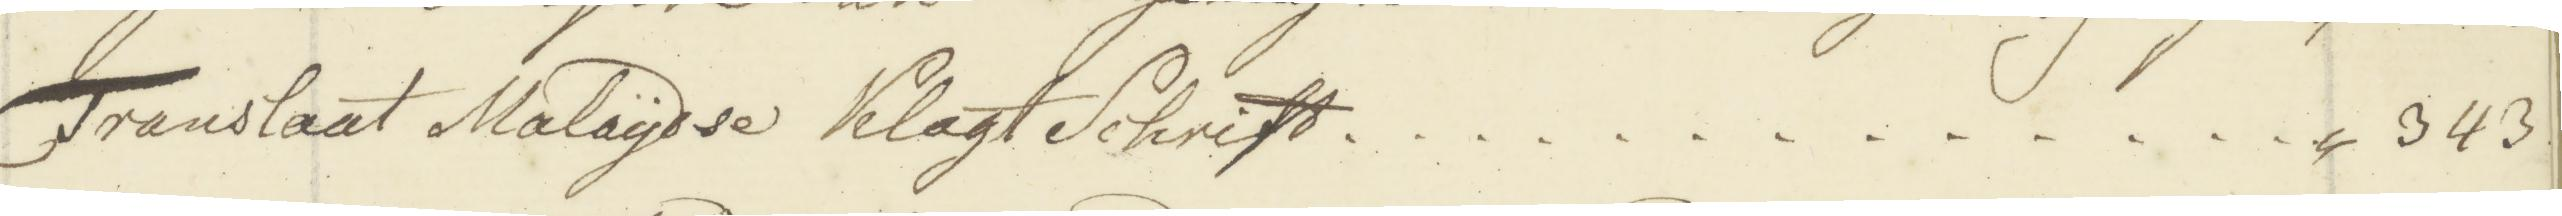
Translaat Malaijdse Klagt Schrift - - - - - - - - - - - - - - „ 343.
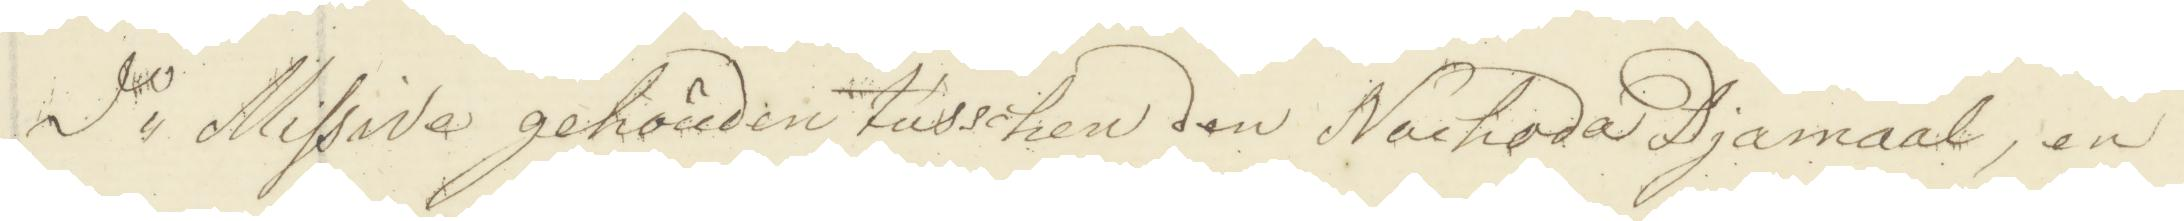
D„o Missive gehouden tusschen den Nachoda Djamaal, en
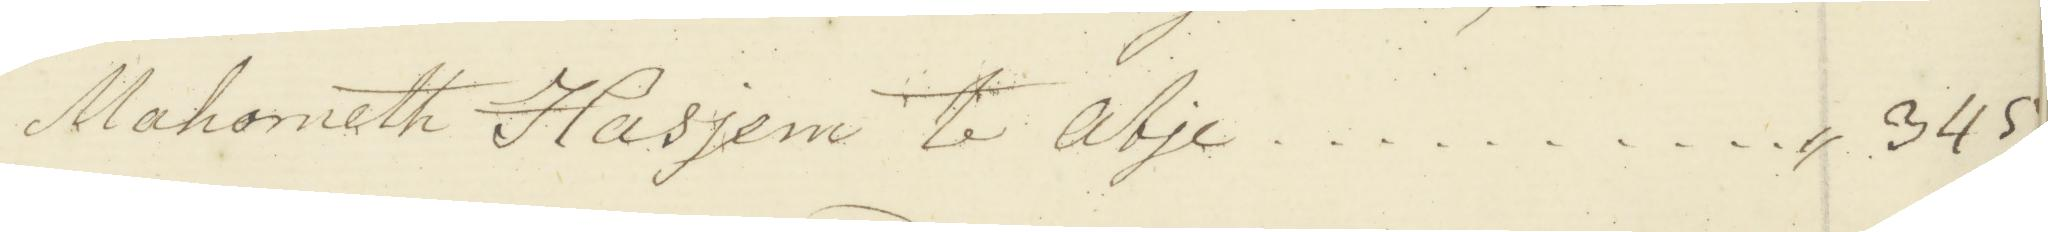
Mahometh Hasjem te abje - - - - - - - - - - „ - - 345
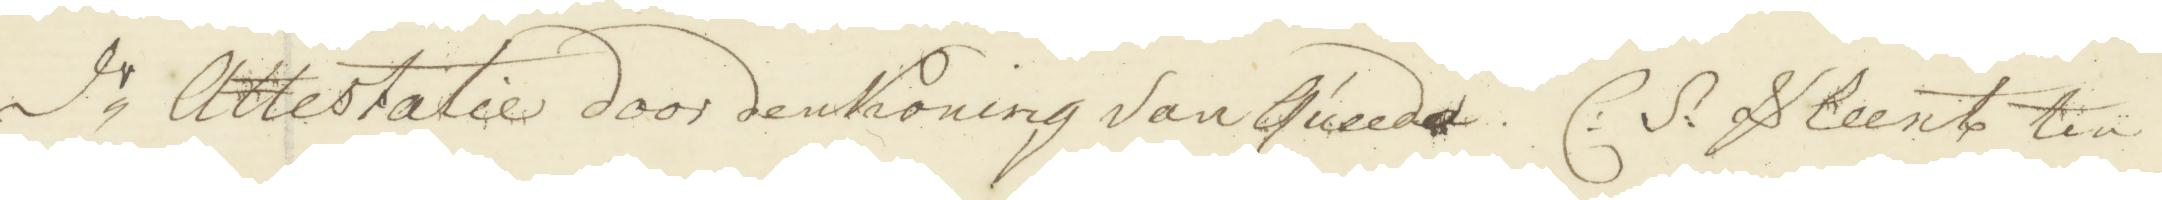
D„r Attestatie door den Koning van Queeda C: S: verleent ten
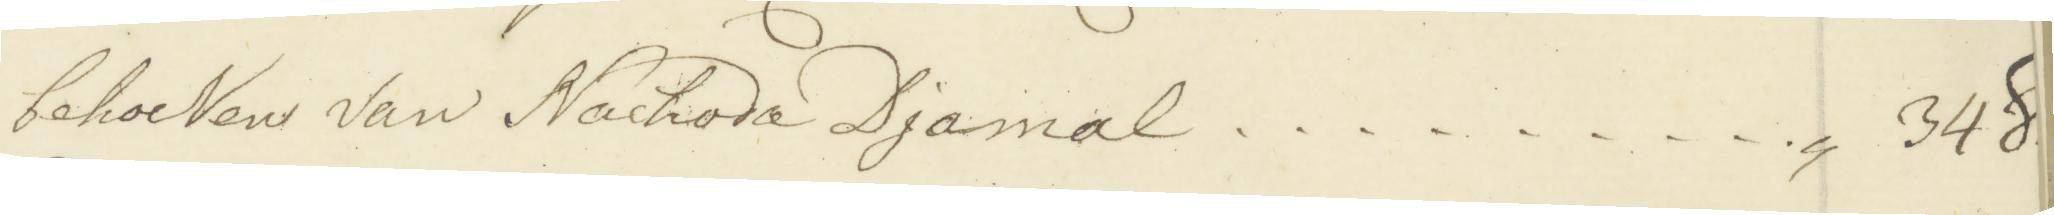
behoeven van Nachoda Djamal - - - - - - - - - „ 348
